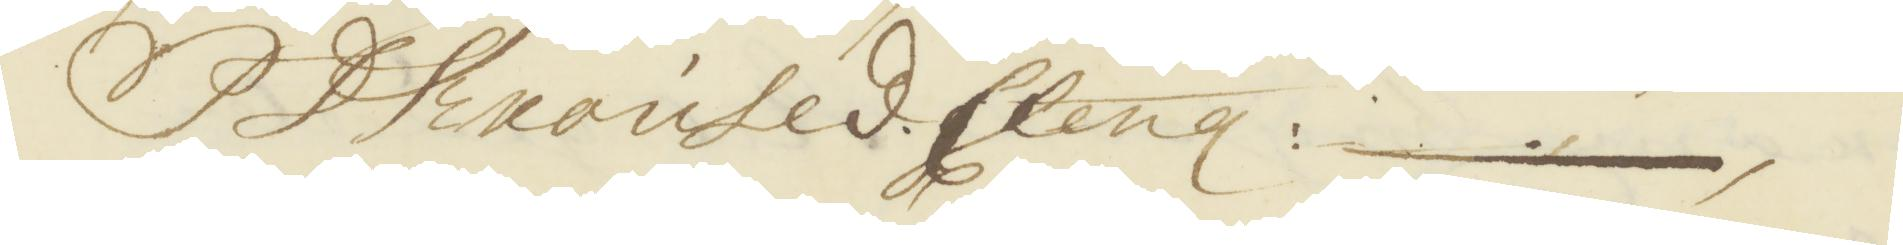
P D krouse d. Clerq:—,
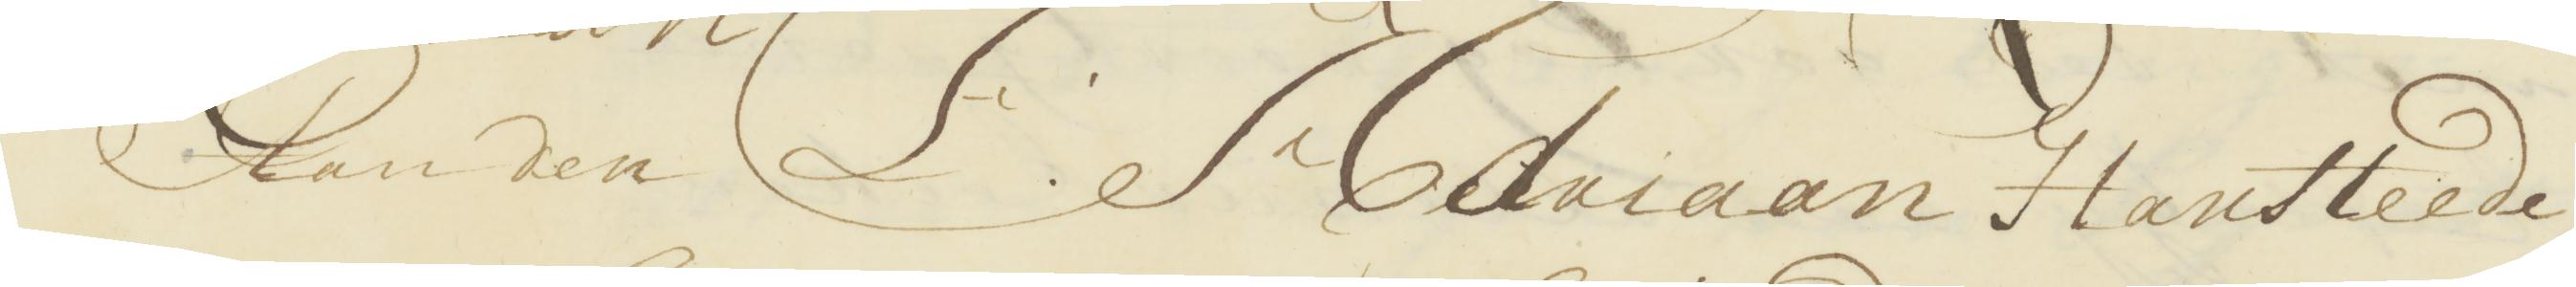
Aan den E: Adriaan Harsteede
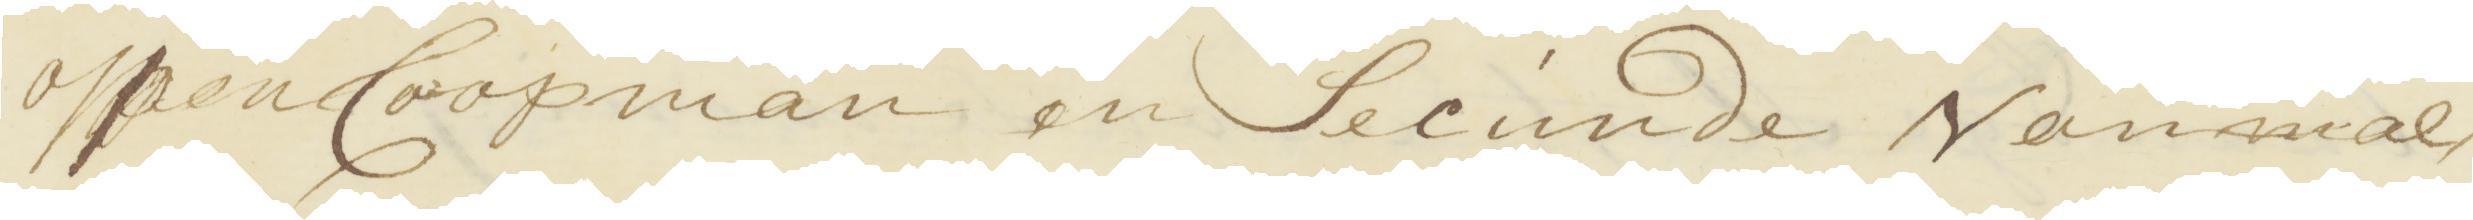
oppercoopman en secunde van mal„
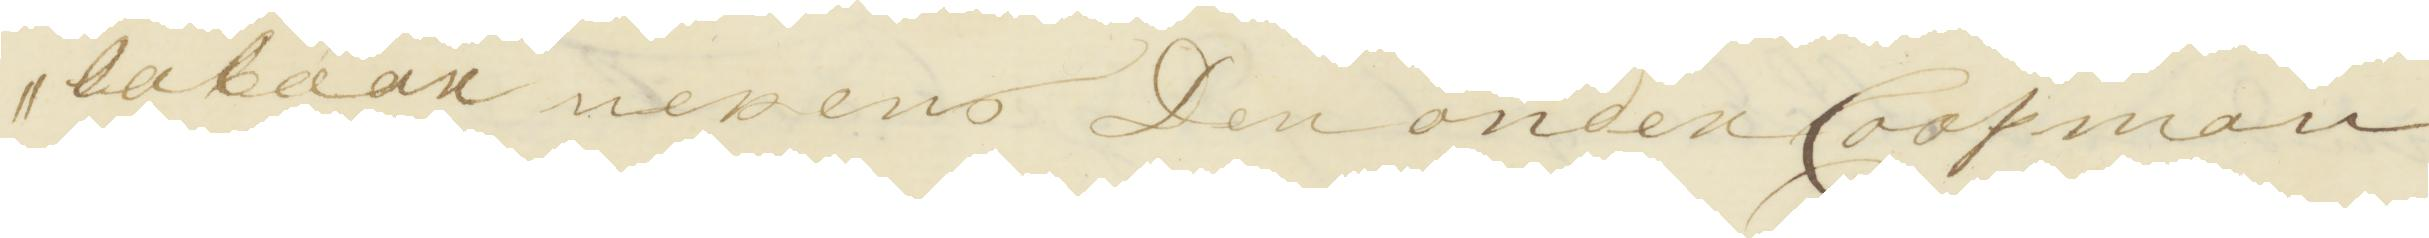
„labaar nevens Den ondercoopman
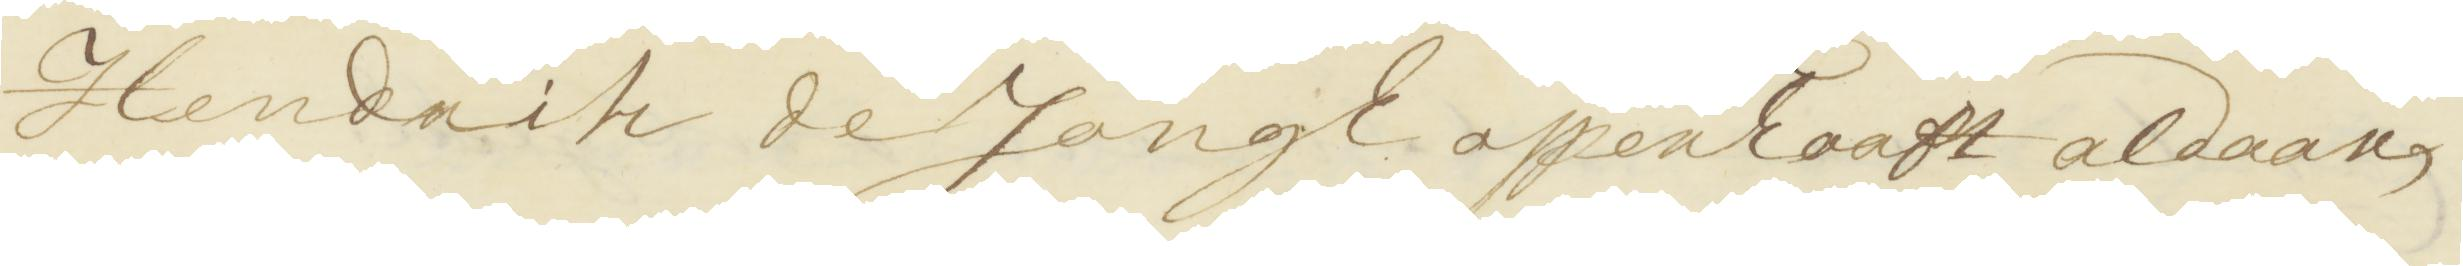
Hendrik de Jongh opperhooft aldaar,
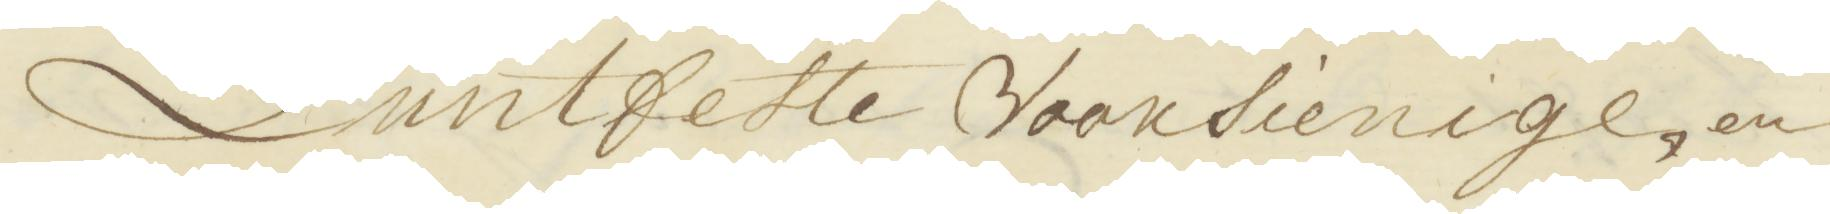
Erntfeste voorsienige, en
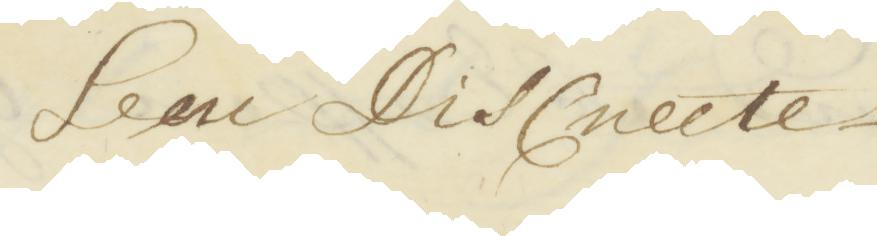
seer Discreete
